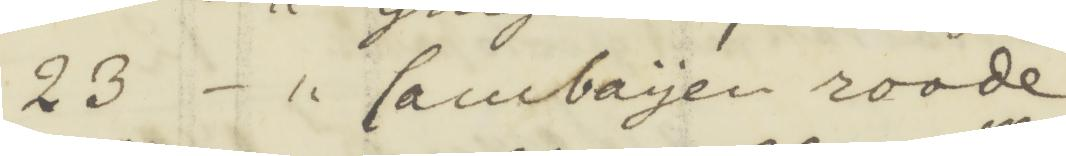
23 - „ Cambaijen roode
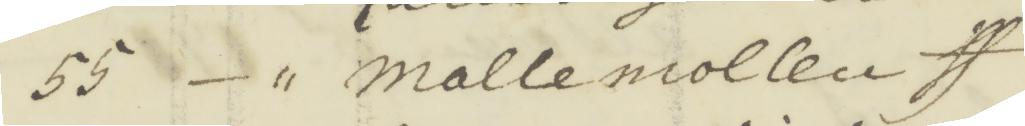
55 - „ malle mollen ff
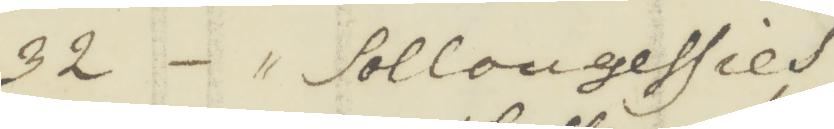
32 - „ sollongessies
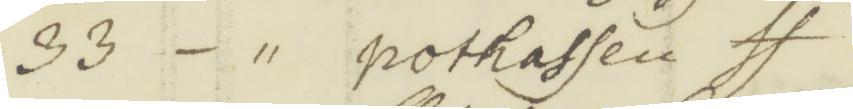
33 - „ pothassen
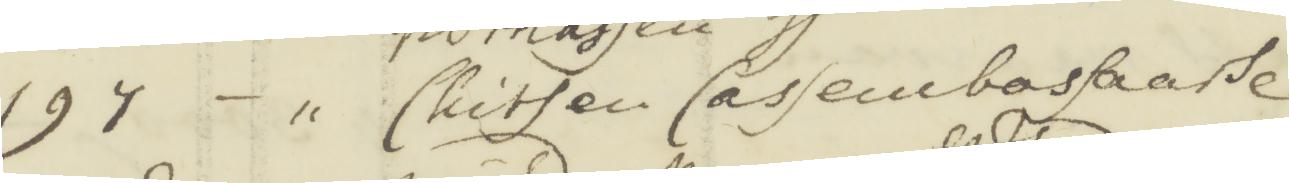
197 - „ Chitsen Cassembossaarse
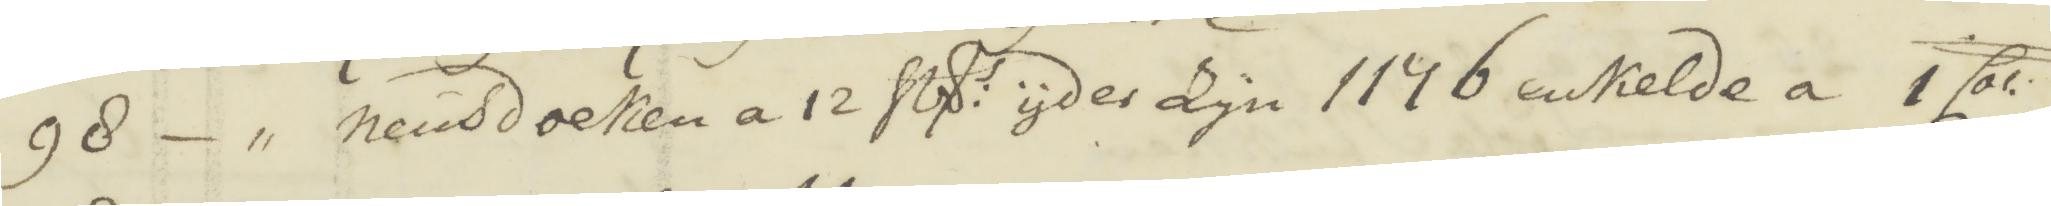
98 - „ neus doeken a 12 stver:s ijder Zijn 1176 enkelde a 1 Ca.
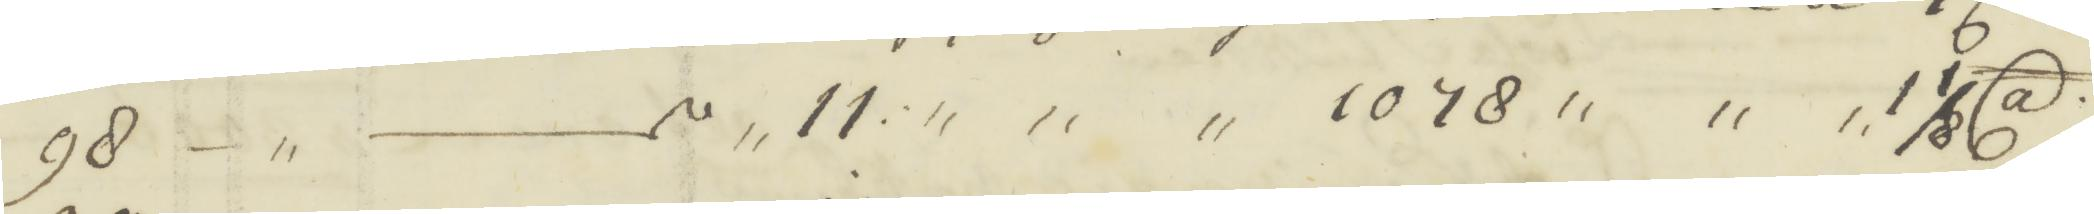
98 - „ _' „ 11: „ „ „ 1078 „ „ „ 1 1/8 @.
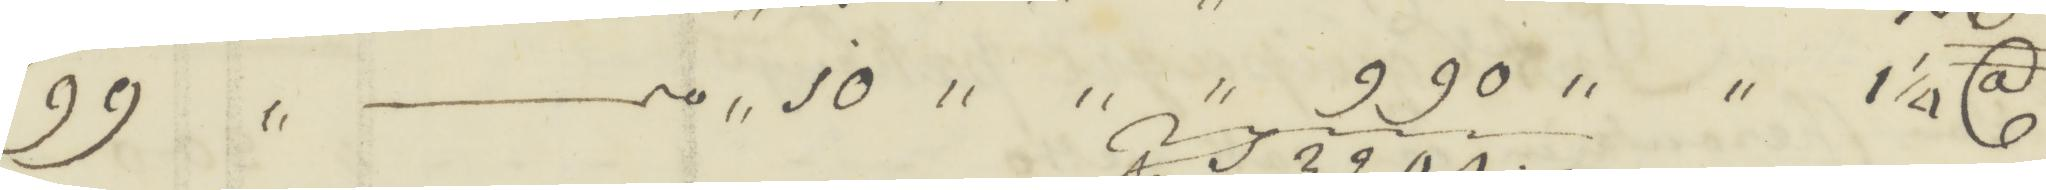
99 „ _' „ 10 „ „ „ 990 „ „ 1¼ @
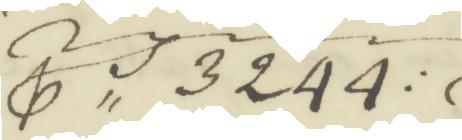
p„s 3244:
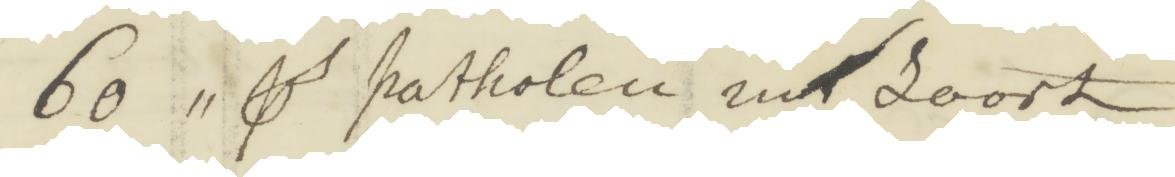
60 „ p:s patholen in't zoort
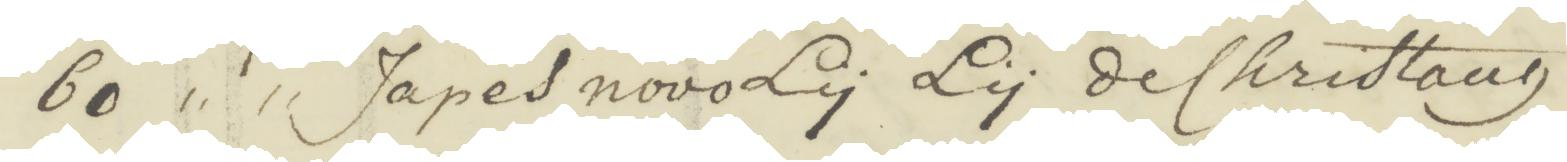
60 „ „ Japes novo Lij Lij de Christang
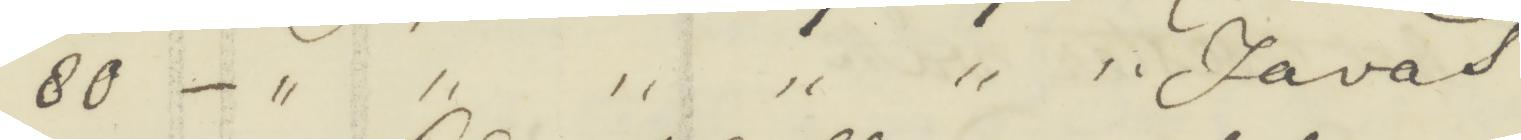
80 - „ „ „ „ „ „ Javas
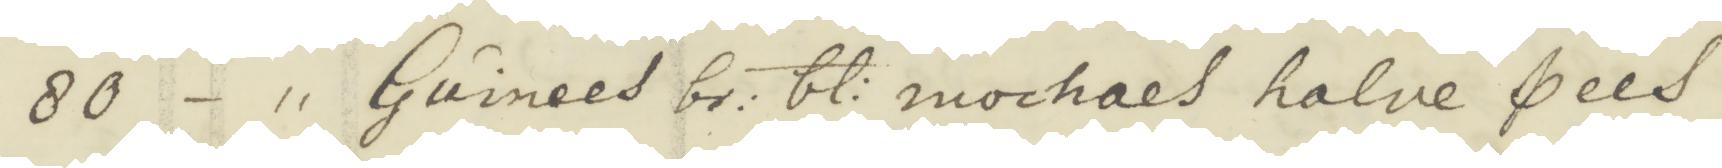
80 - „ Guinees br: bl: mochaes halve pees
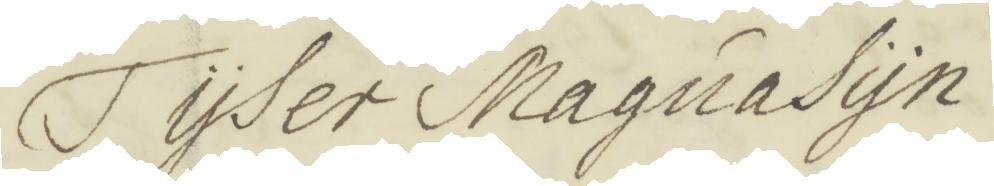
'T ijser Maguasijn
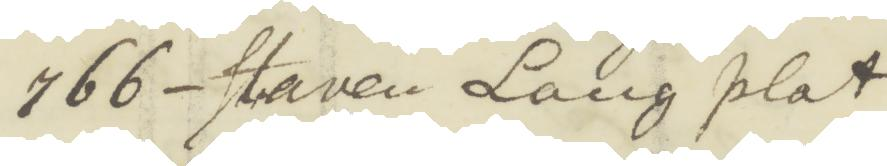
766 - staven Lang plat
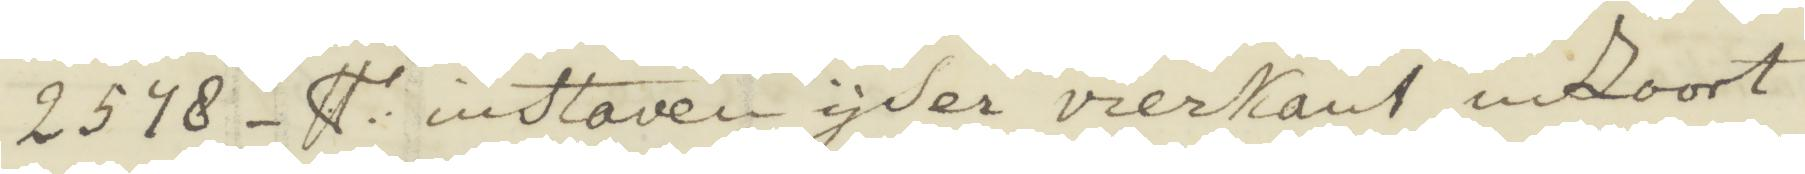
2578 - st:s instaven ijser vierkant inzoort
